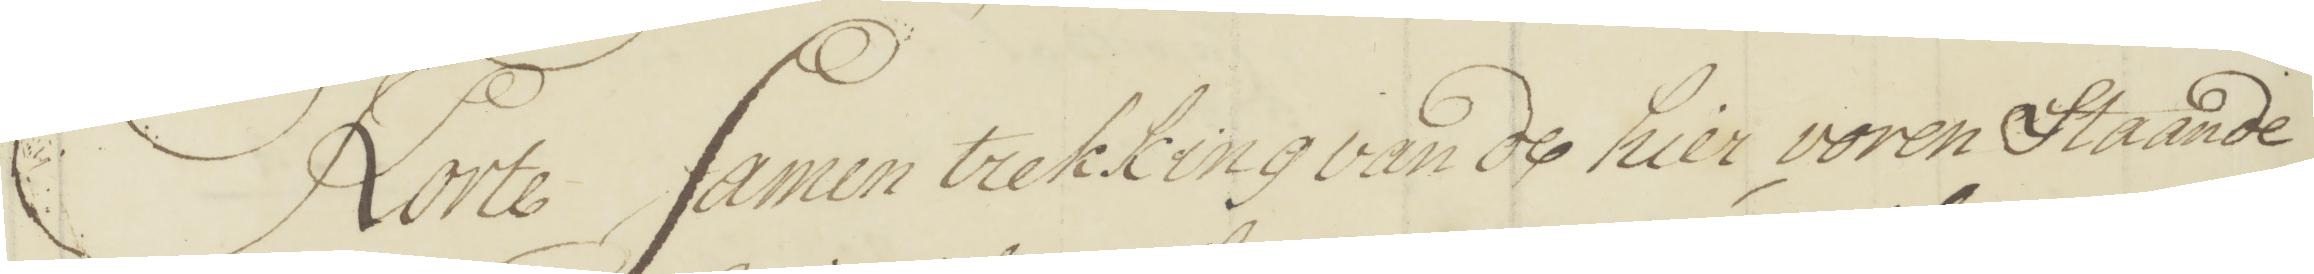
Korte Samen trekking van de hier voren staande
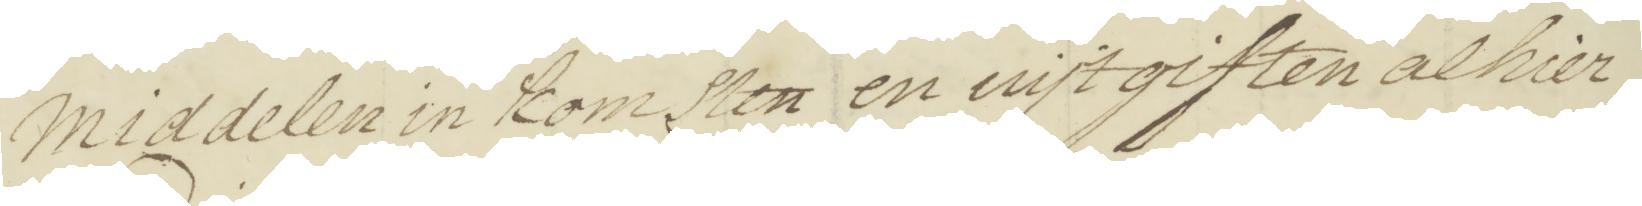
middelen in kom sten en uijtgiften alhier
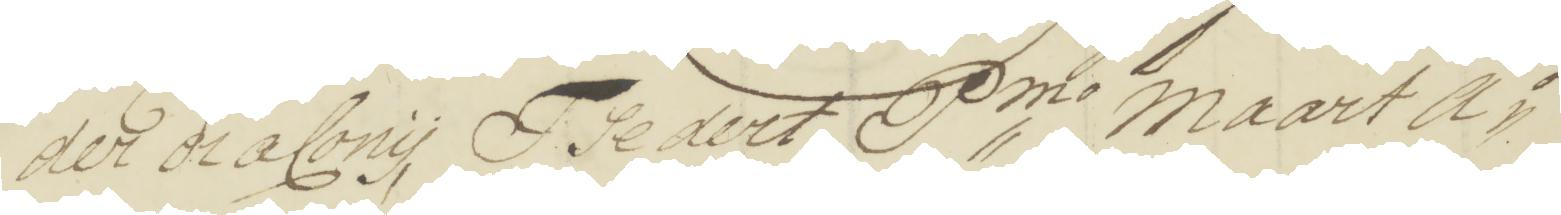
der diaconij T sedert P„mo maart A„o
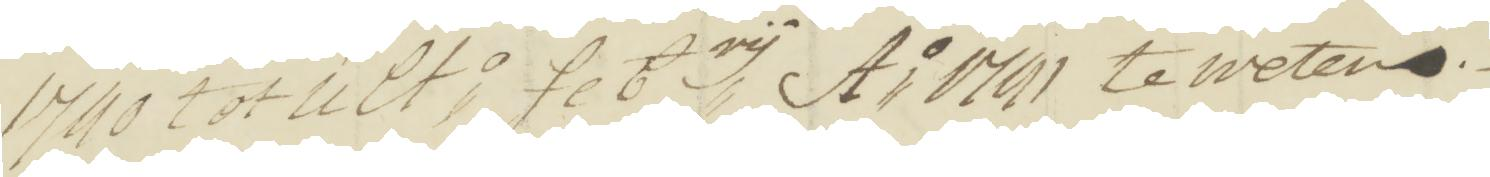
1740 tot ult„o feb„rij A„o 1741 te weten.
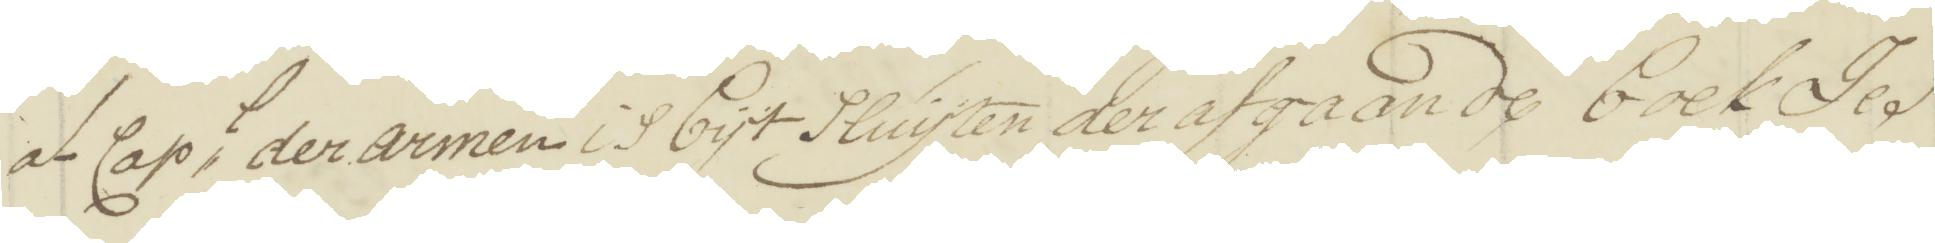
a- cap„l der armen is bij t sluijten der afgaande boekIes
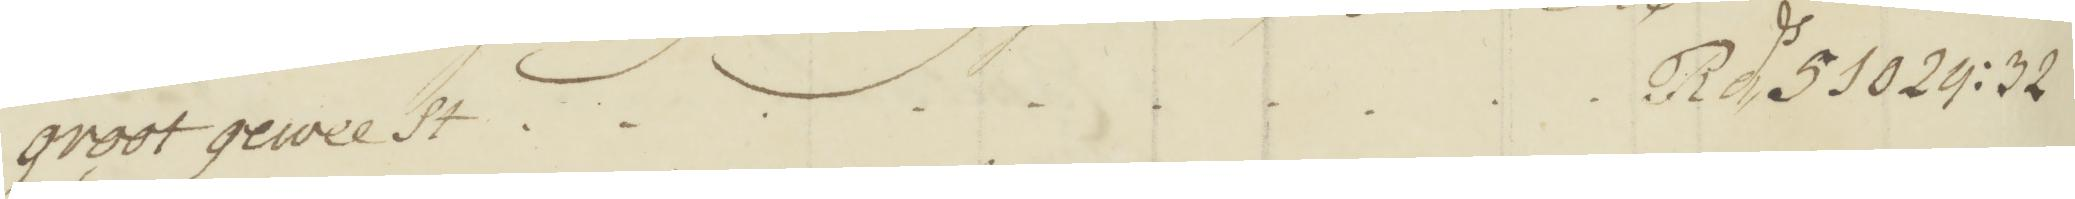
groot geweest - - - - - - - - - - - Rd„s 51024:32
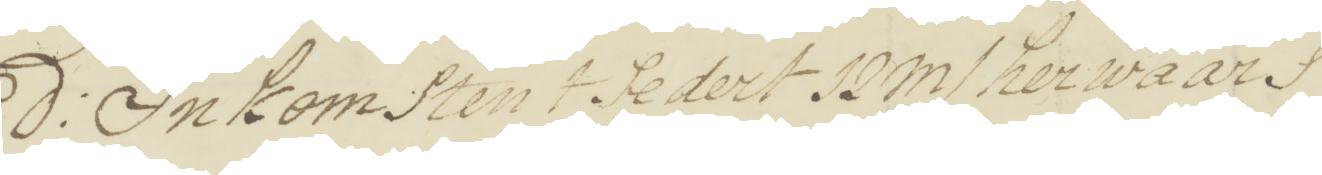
d: In komsten t sedert 12 m/ herwaars
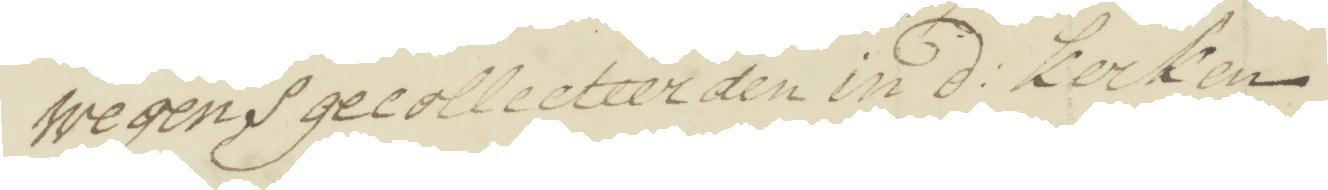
wegens gecollecteerden in d: kerken
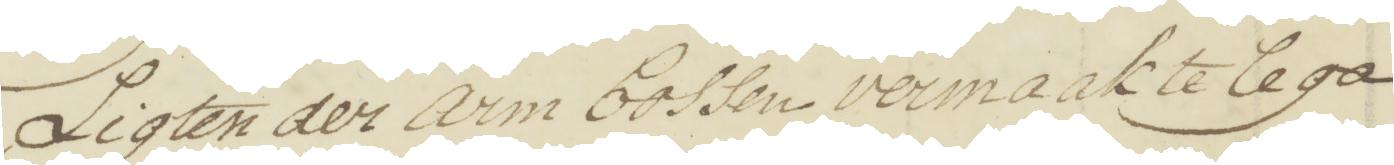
Ligten der Arm bossen vermaakte lega
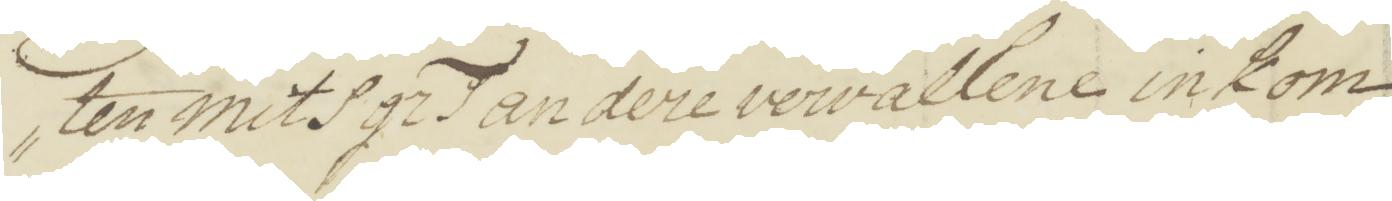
„ten mitsgr T an dere vervallene in kom
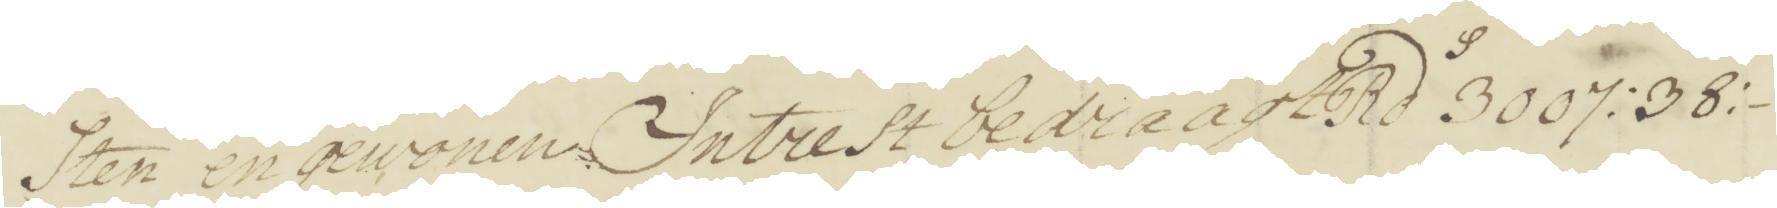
sten en gewonen Jntrest bedraagt Rds 3007:38:-
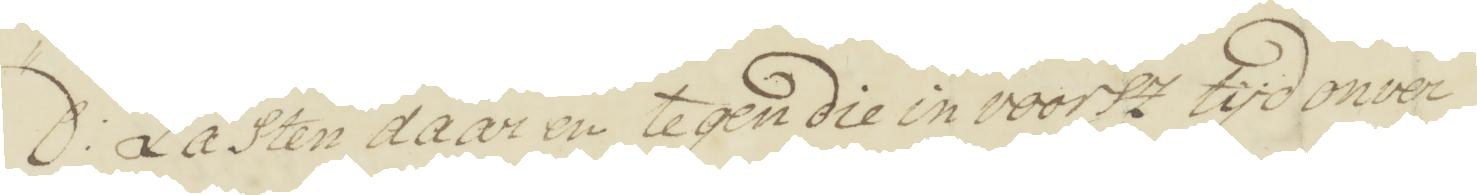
d: Lasten daar en tegen die in voorsz tijd onver
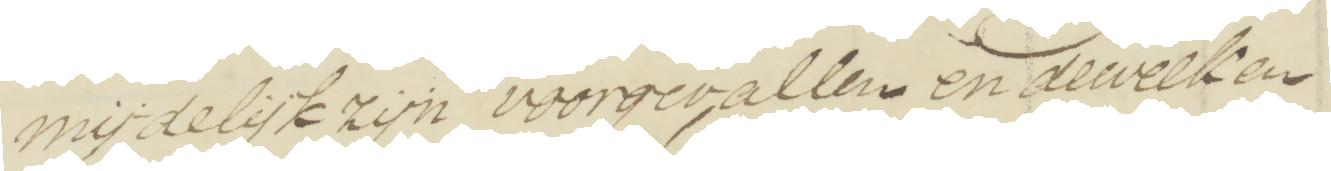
mijdelijk zijn voorgevallen en dewelken
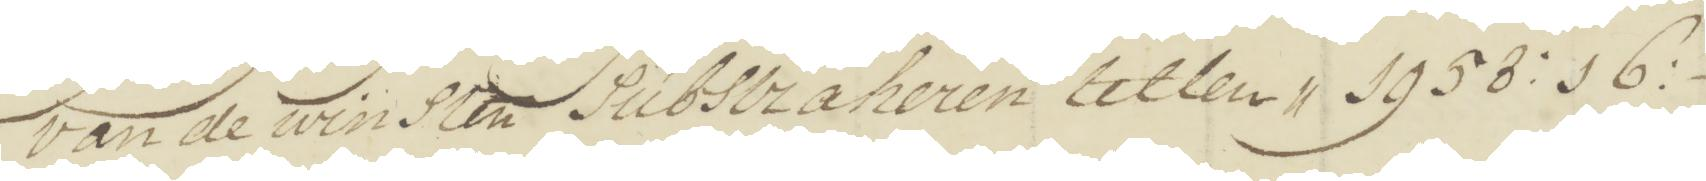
van de winsten substraheren tellen „ 1958: 16:
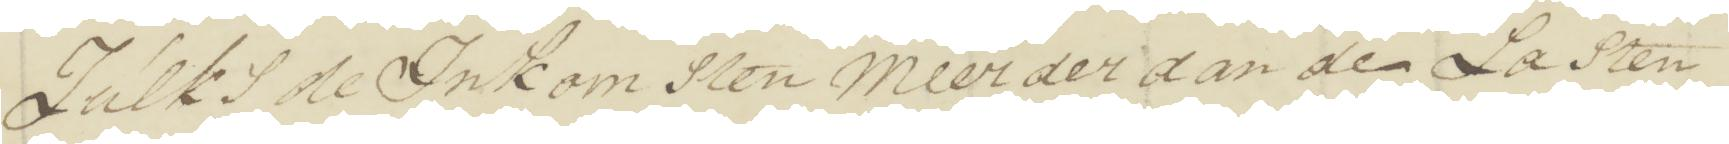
zulks de Inkom sten meer der dan de Lasten
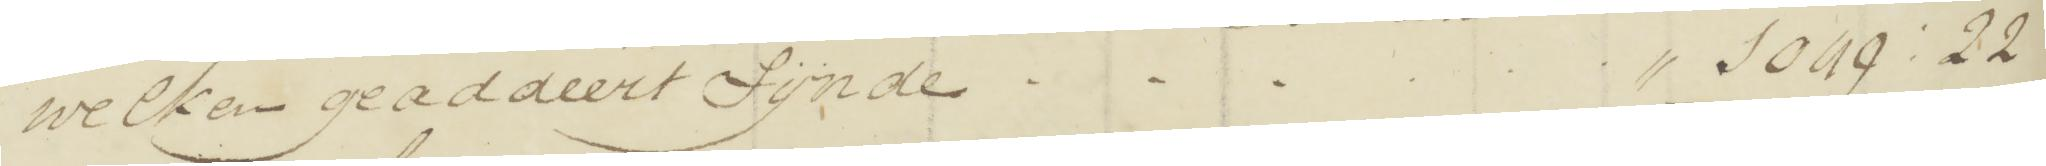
welken geaddeert sijnde - - - - - - „ 1049 : 22
